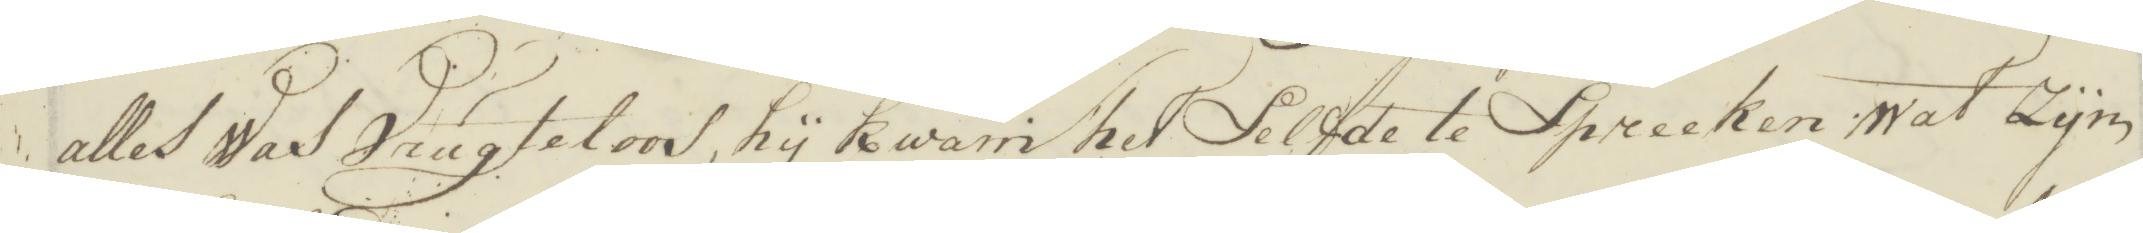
alles was Vrugteloos, hij kwam het selfde te spreeken wat zijn
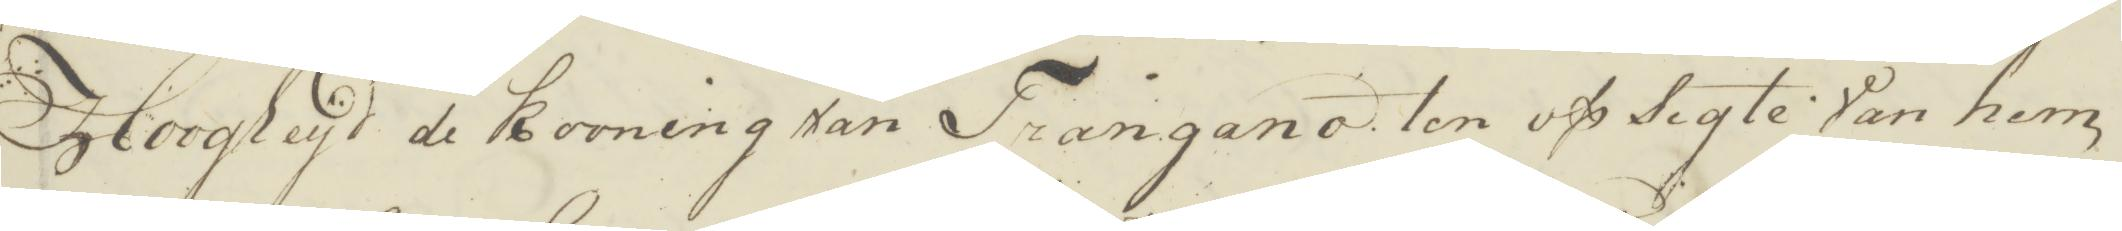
Hoogheijd de kooning van Trangano ten op sigte van hem
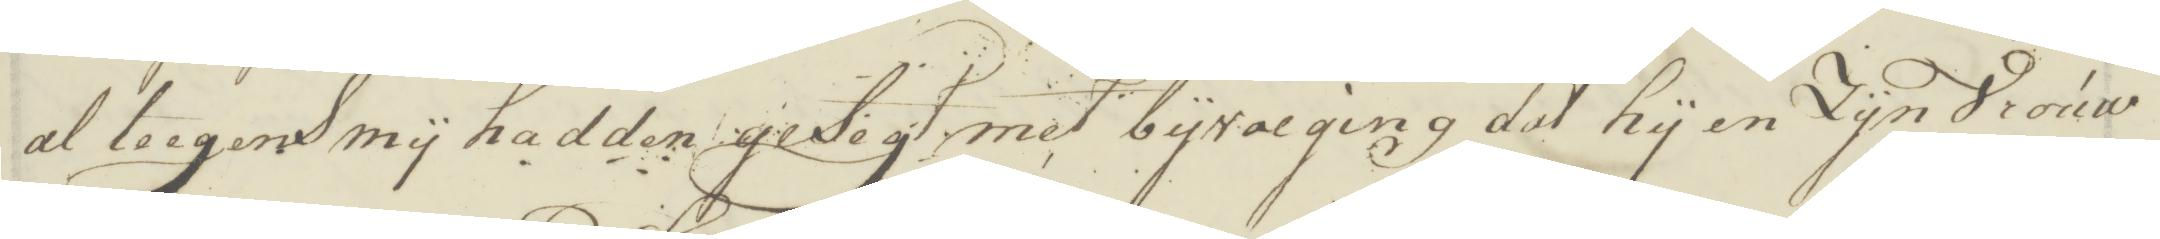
al teegens mij hadden gesegt met bijvoeging dat hij en zijn Vrouw
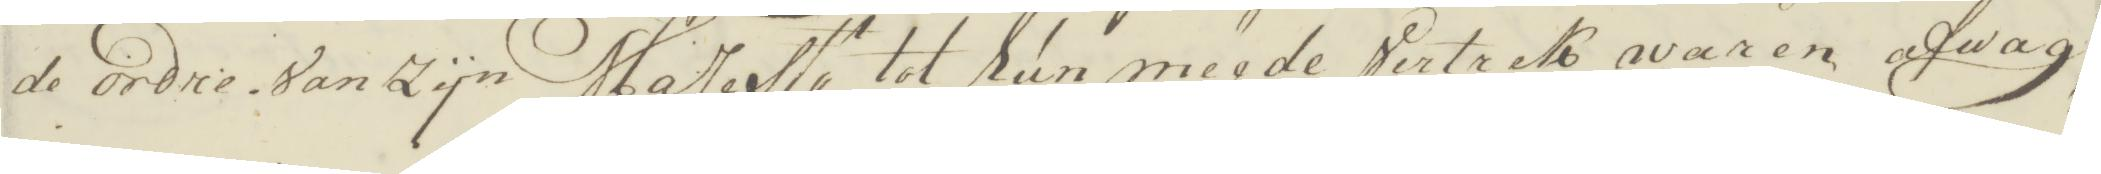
de ordre. van zijn Majest„t tot hun meede vertrek waren afwag„
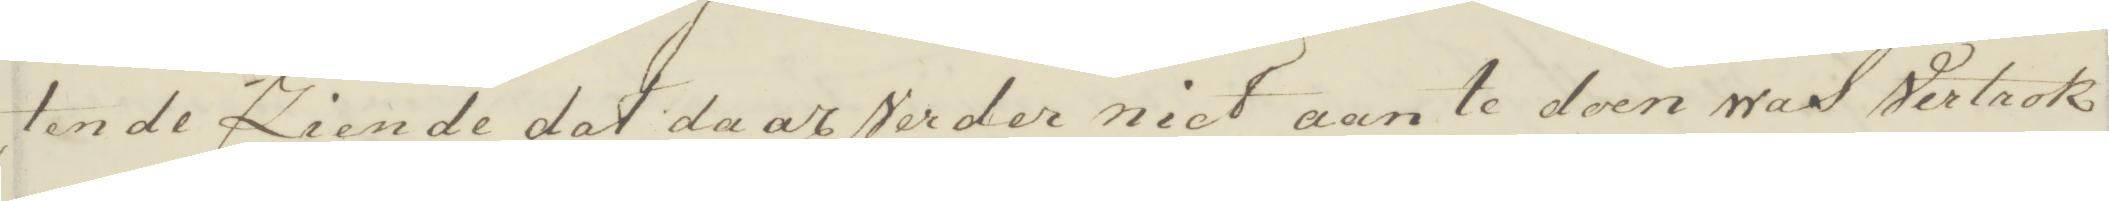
„ten de ziende dat daar verder niet aan te doen was vertrok
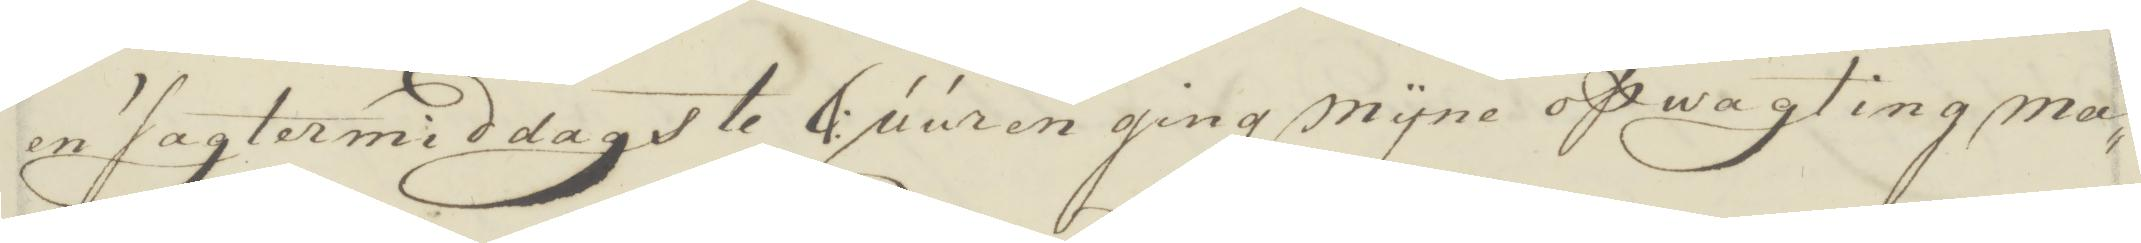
en 's agtermiddagste 4: uuren ging mijne opwagting ma„
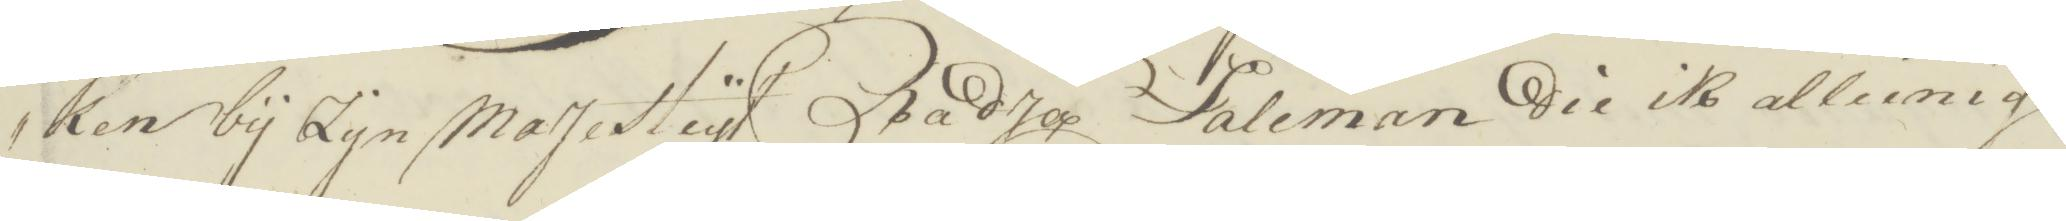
„ken bij zijn majestijt Radja Saleman die ik alleenig
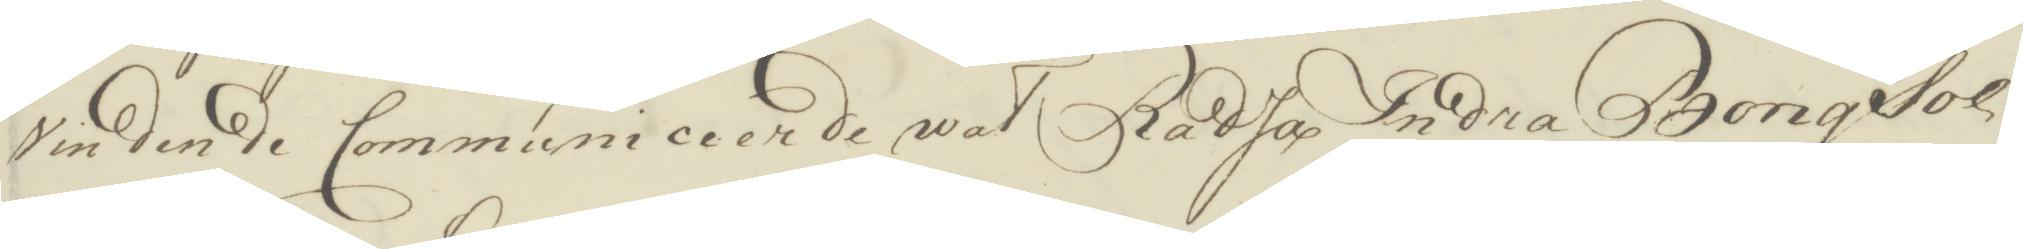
vinden de Communiceerde was Radja Indra Bongsoe
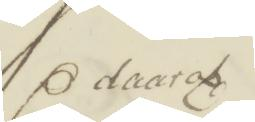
daarop
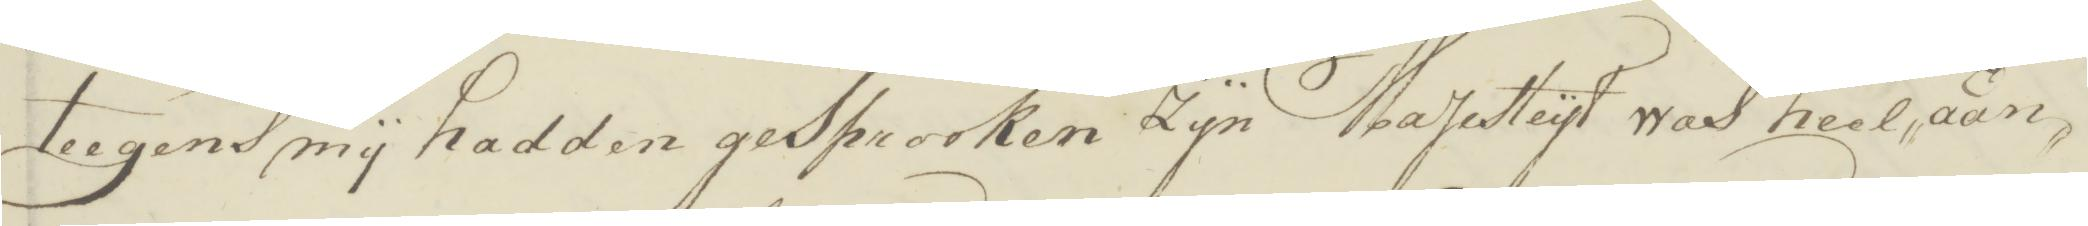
teegens mij hadden gesprooken zijn Majesteijt was heel „ aan„
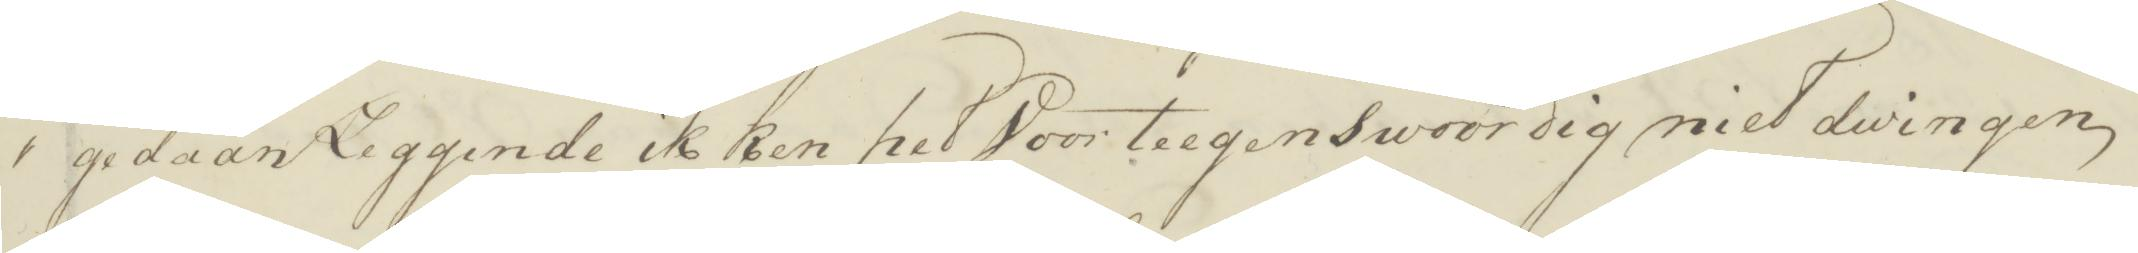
„gedaan zeggende ik ken het Voor teegenswoordig niet dwingen
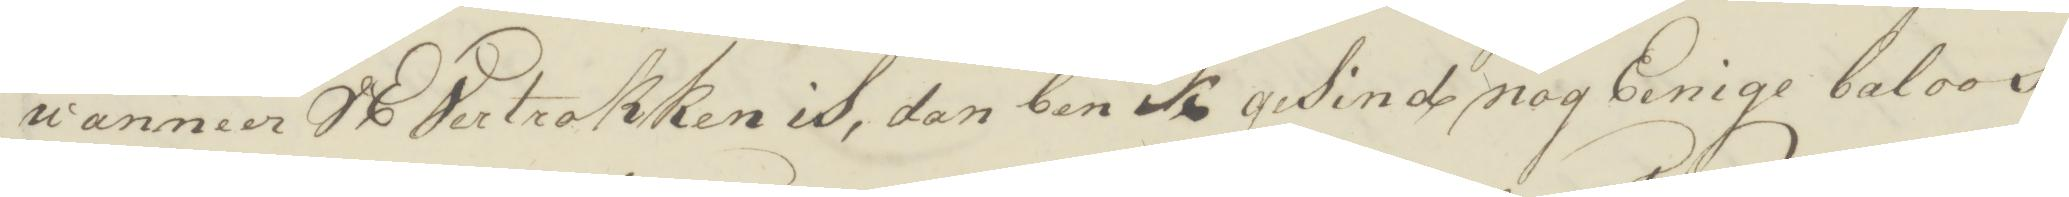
wanneer VE Vertrokken is, dan ben ik gesind nog Eenige baloos
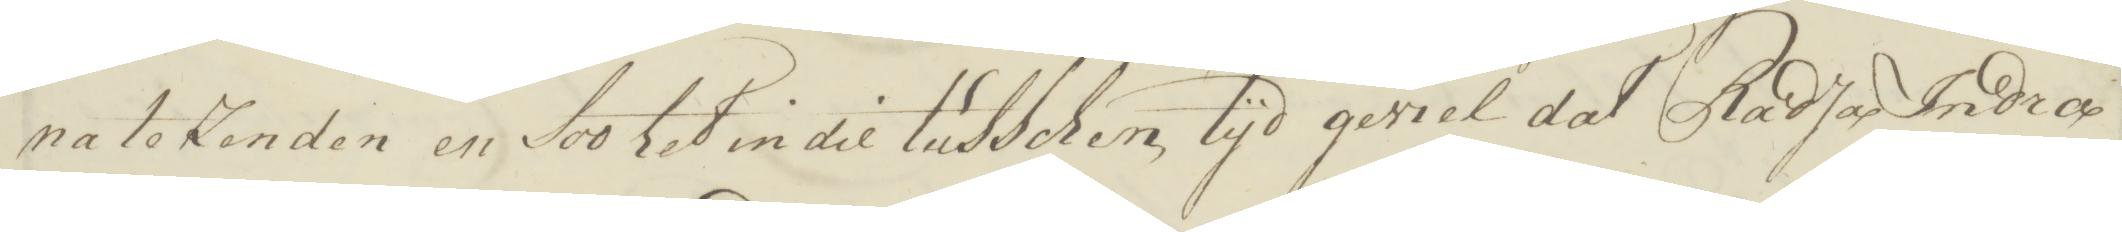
na te zenden en soo het in die tusschen tijd geviel dat Radja Indra
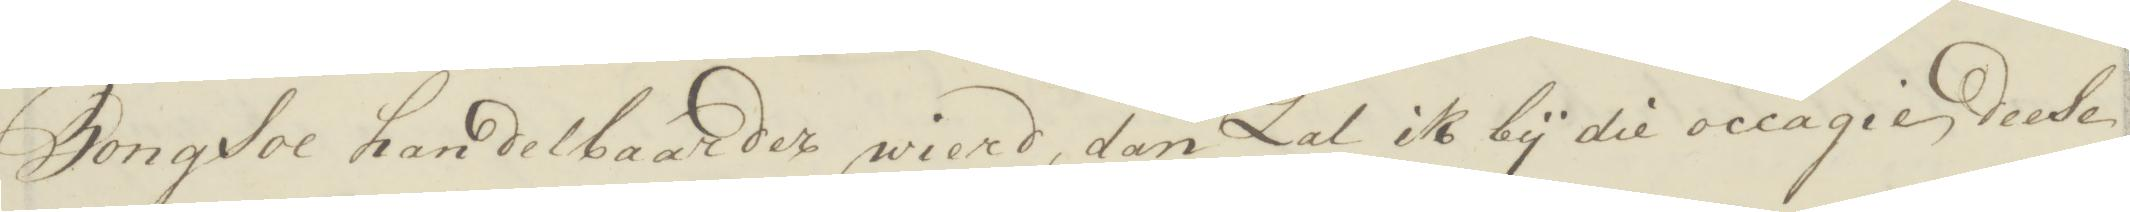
Bongsoe handelbaarder wierd, dan zal ik bij die occagie deese
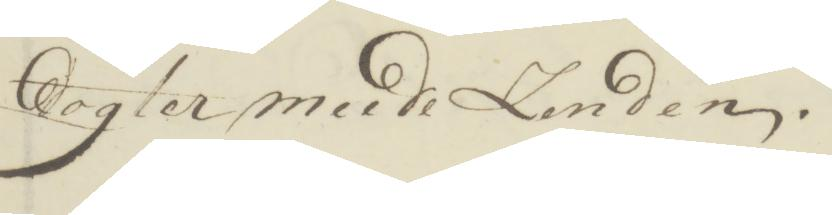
dogter meede zenden.
